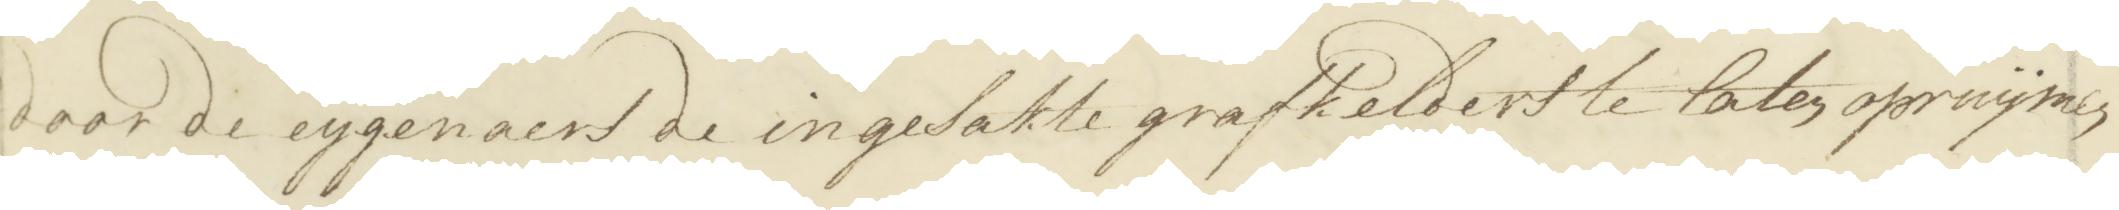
door de eijgenaers de ingesakte grafkelderste laten opruijmen
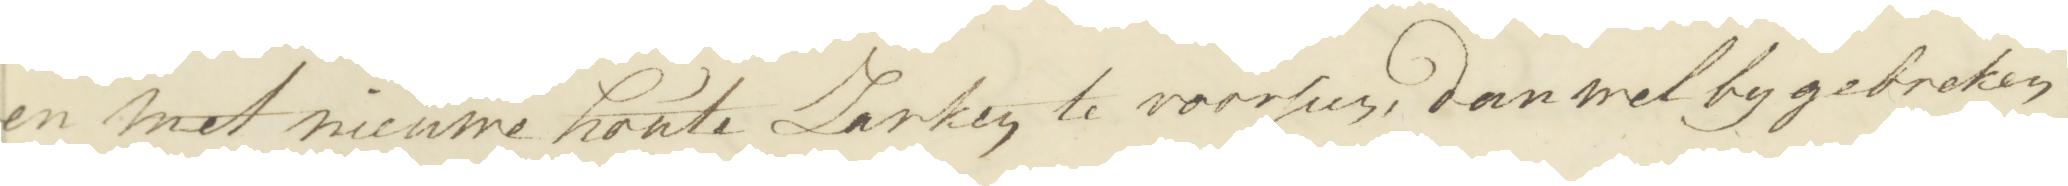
en met nieuwe houte zarken te voorsien, dan wel by gebreken
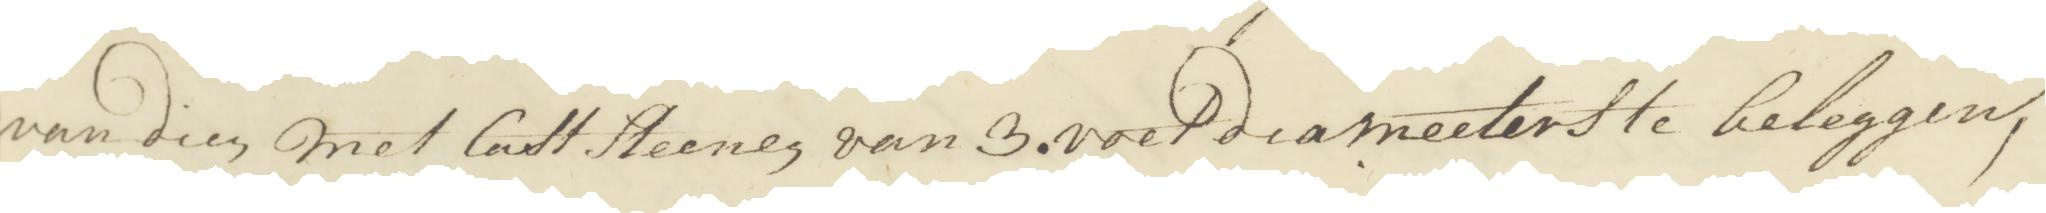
van dien met Cust Steenen van 3. voet diameeters te beleggen,
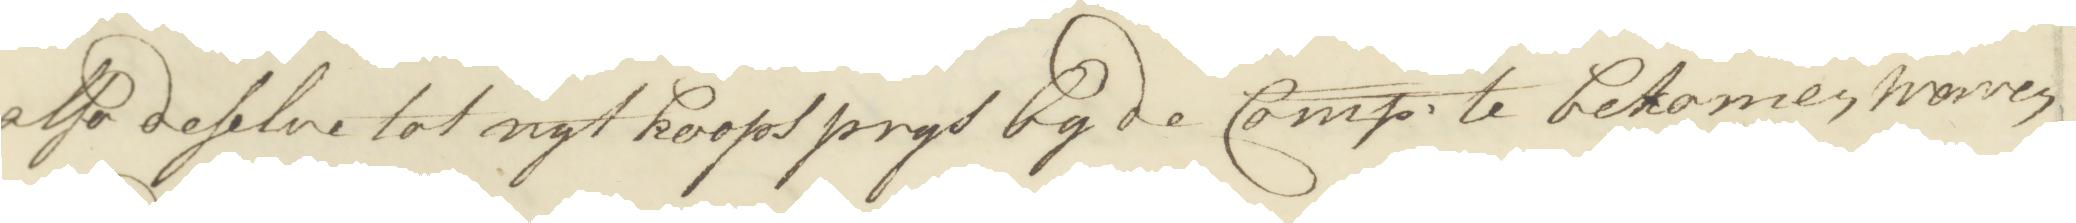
also deselve tot nyt koops prys by de Comp: te bekomen waren
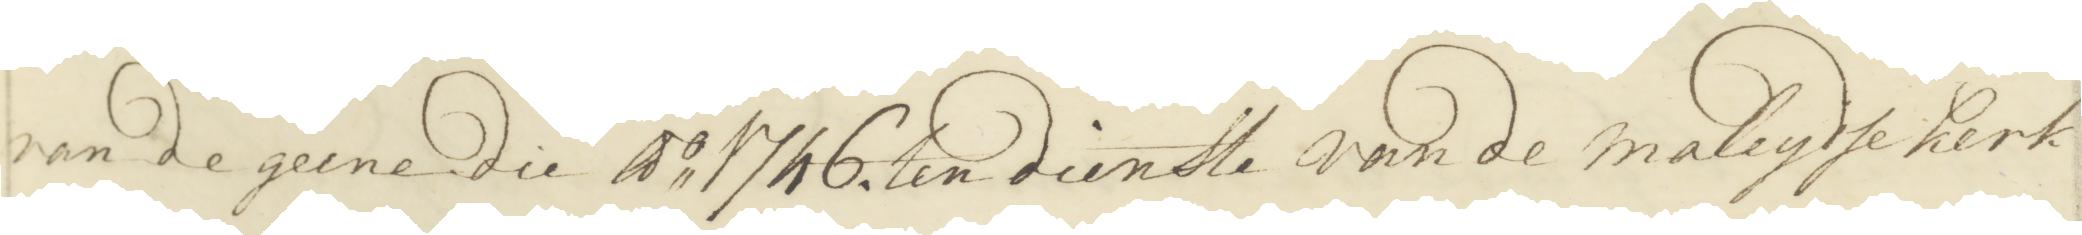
van degeene die a„o 1746. ten dienste van de maleydse kerk
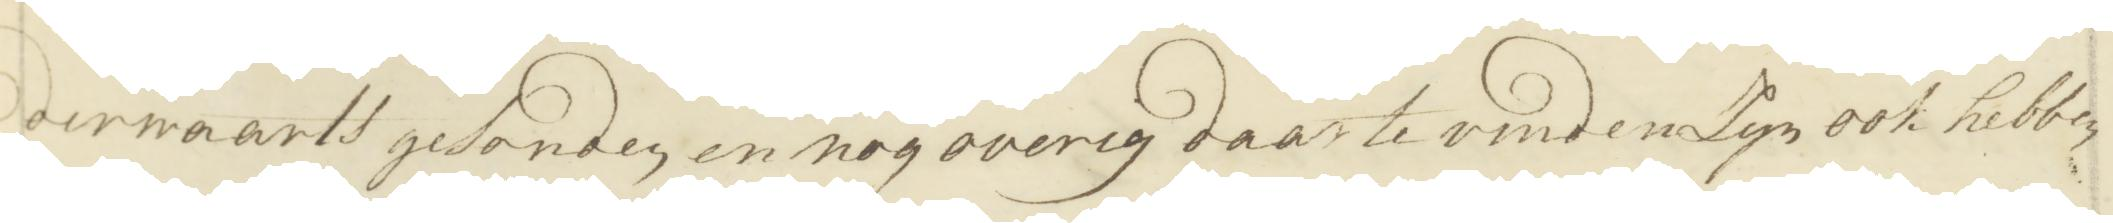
derwaarts gesonden en nog overig daar te vinden zyn ook hebben
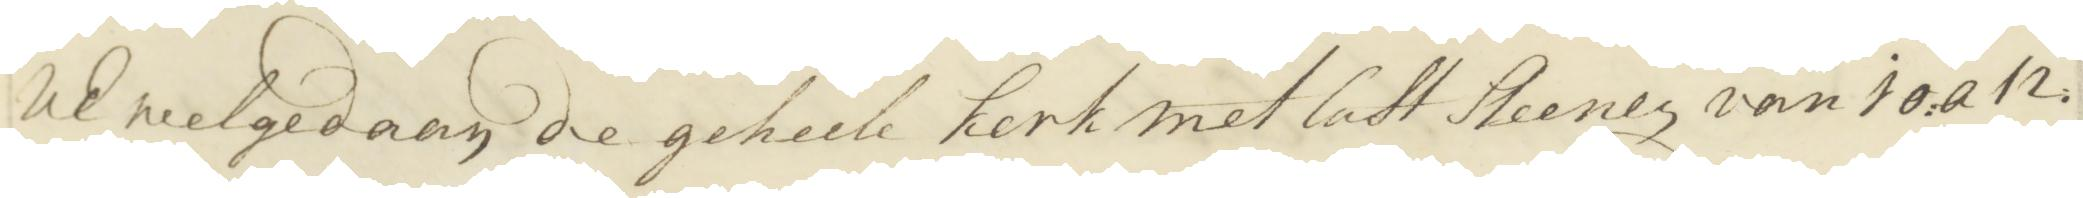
UE welgedaan de geheele kerk met Cust steenen van 10: a 12:
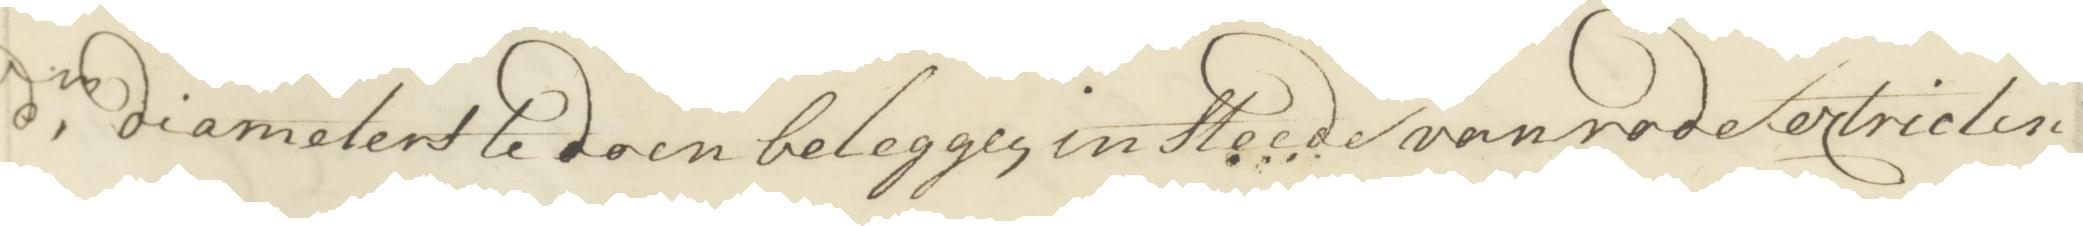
d,m diameters te doen beleggen in steede van rode extricten
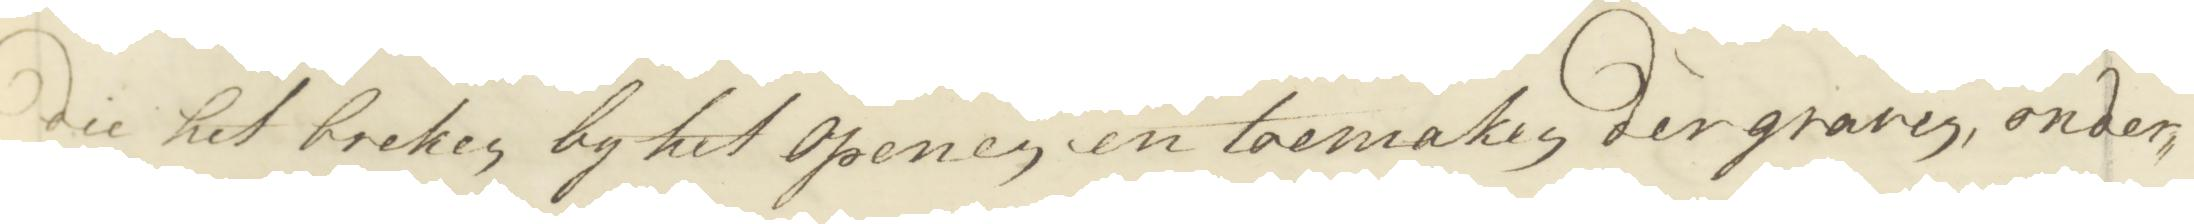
die het breken by het openen en toemaken der graven, onder„
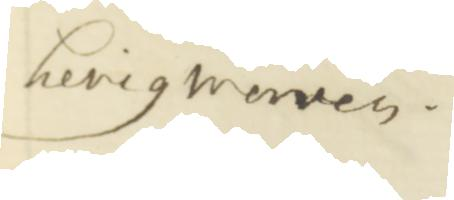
hevig waren.
